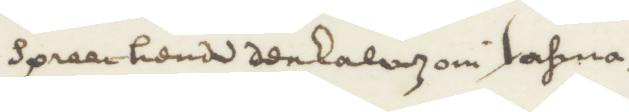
spraackende derhalven om 't afm„
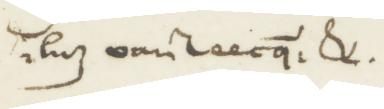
=ken van reecq: &.
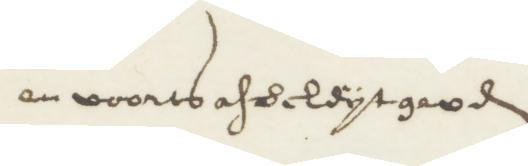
en voorts afscheijt geven
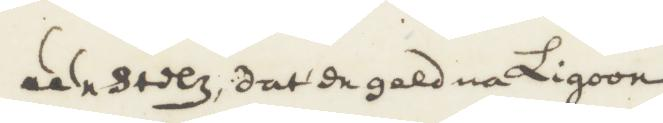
eerstelijk, dat 'er geld na Ligoor
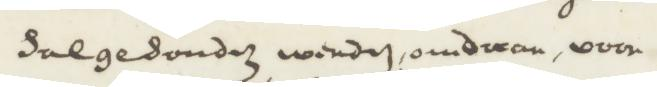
sal gesonden werden, om daar, voor
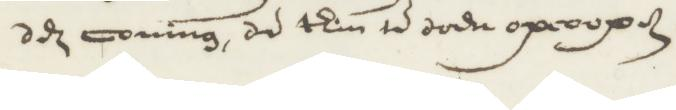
den coning, de thin te doen opcoopen.
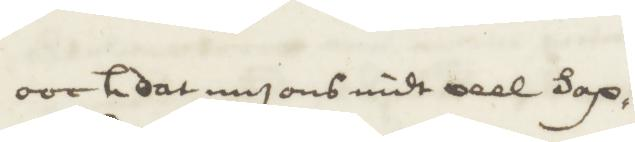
oock dat men ons niet veel sap„
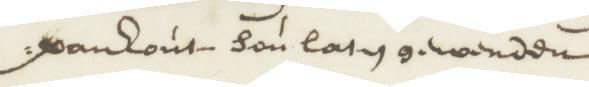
=panhout sou laten gewerden
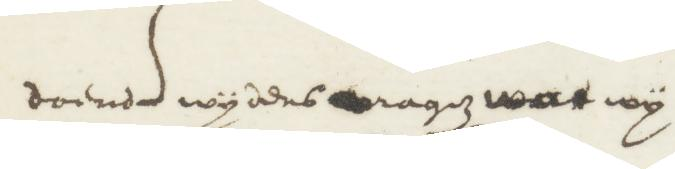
doende wijders vragen wat wij
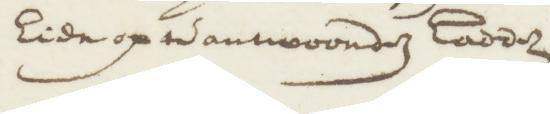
hier op te antwoorden hadden.
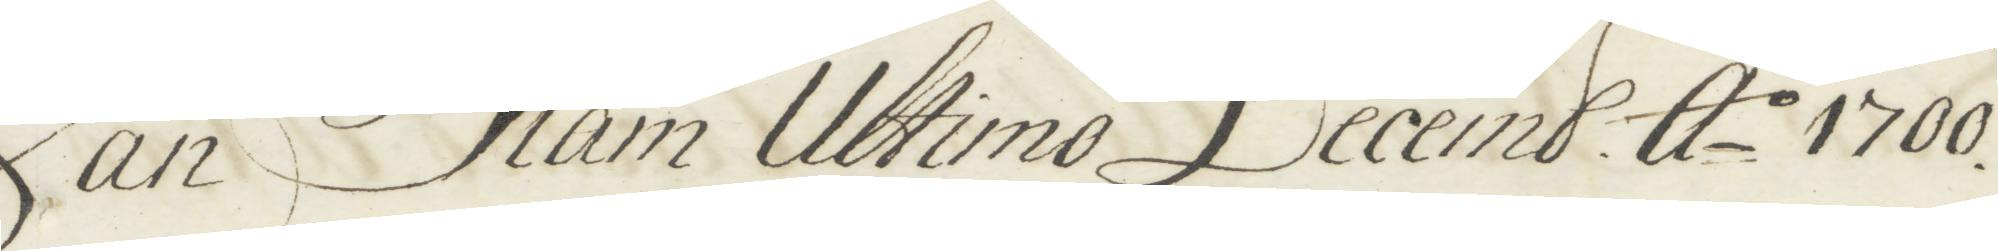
Van Siam Ultimo Decemb: A-o 1700.
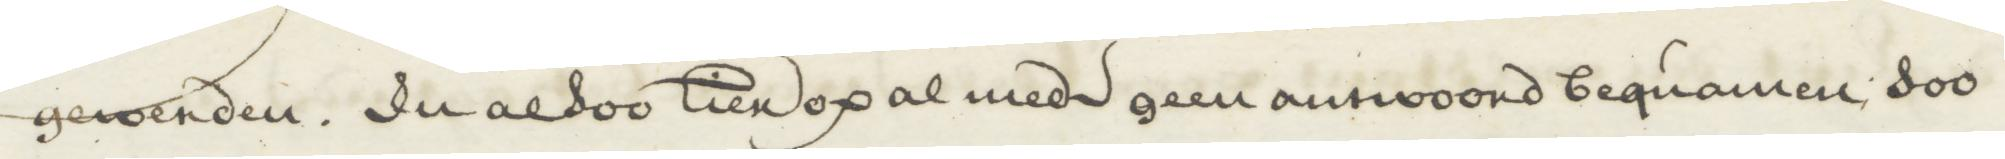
gewerden. En alsoo hier op al mede geen antwoord bequamen; soo
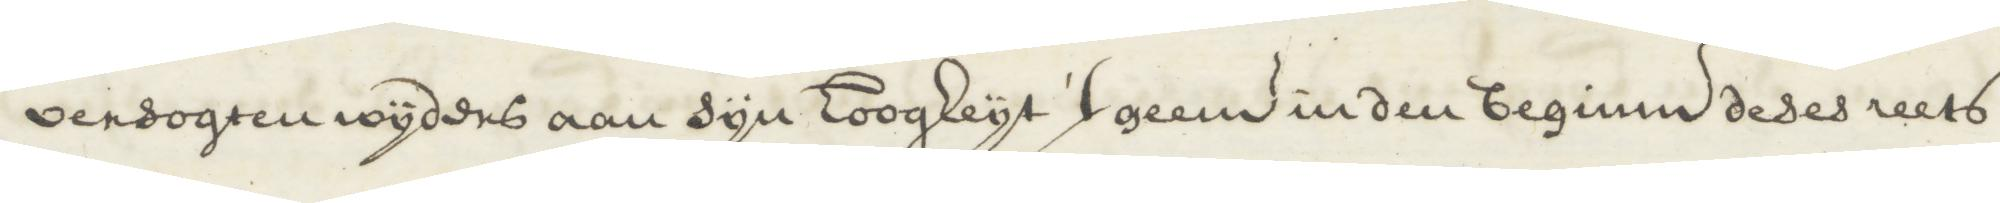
versogten wijders aan sijn hoogheijt ’t geene in den beginne deses reets
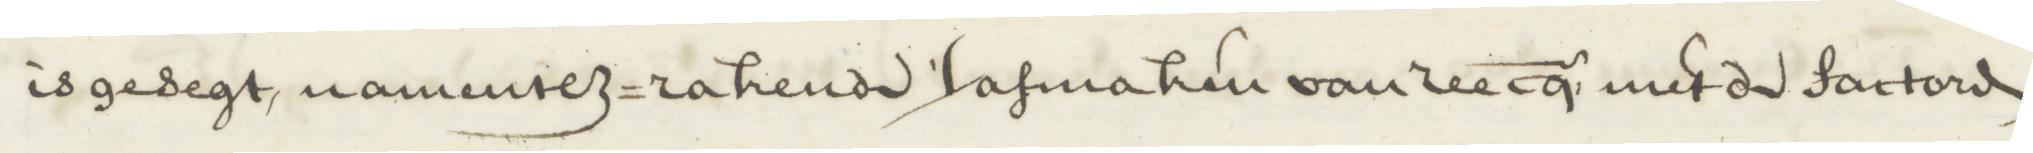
is gesegt, namentlijk rakende ’t afmaken van reecq: met de factoren
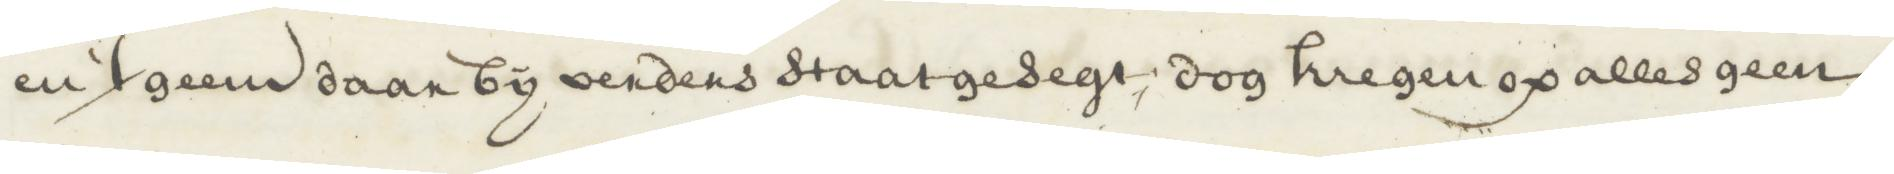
en ’t geene daar bij verders staat gesegt; dog kregen op alles geen
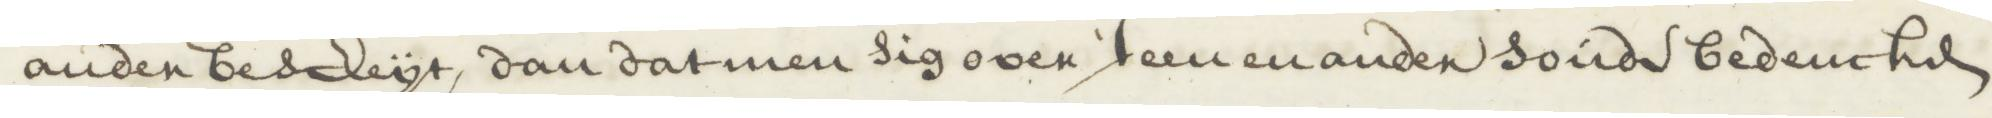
ander bescheijt, dan dat men sig over 't een en ander soude bedencken
